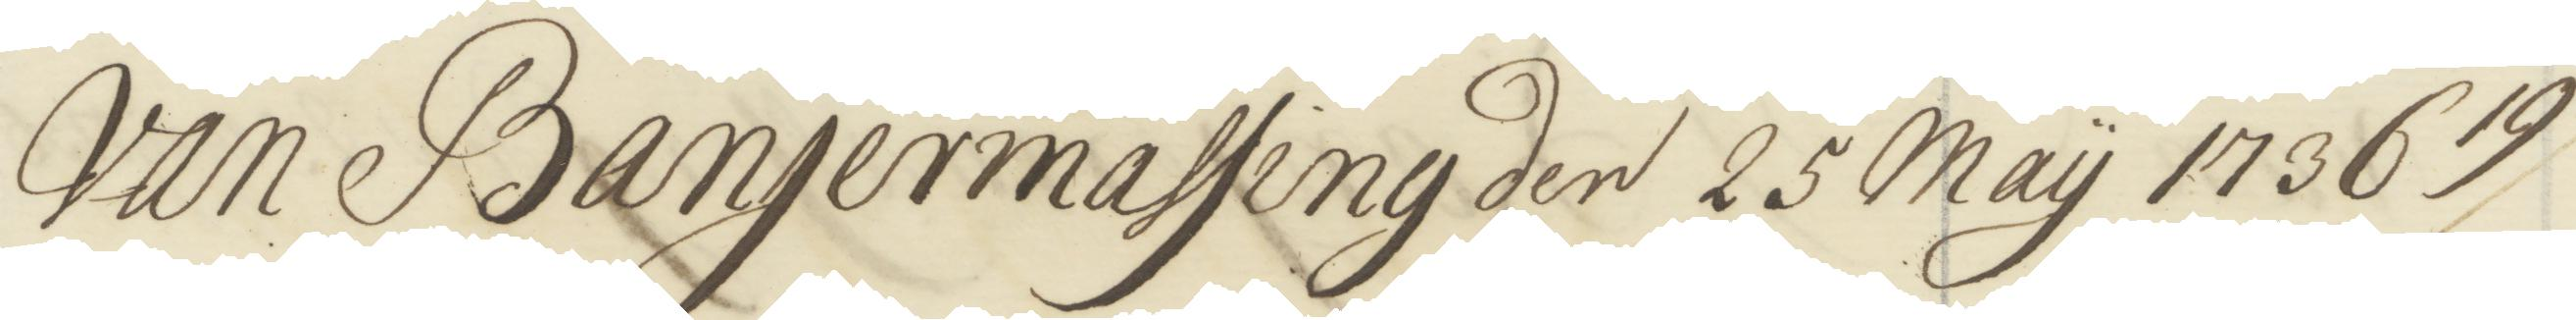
Van Banjermassing den 25 Maij 1736 19/
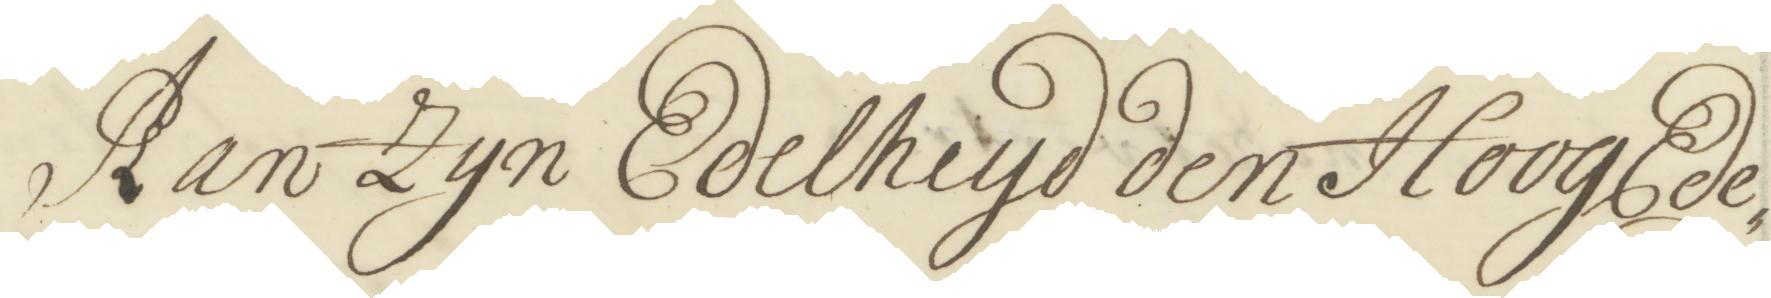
Aan zijn Edelheijd den Hoog Ede„
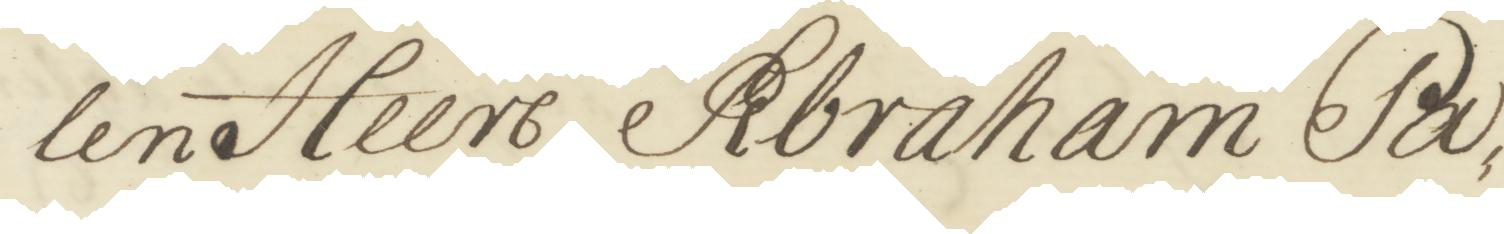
len Heere Abraham Pa
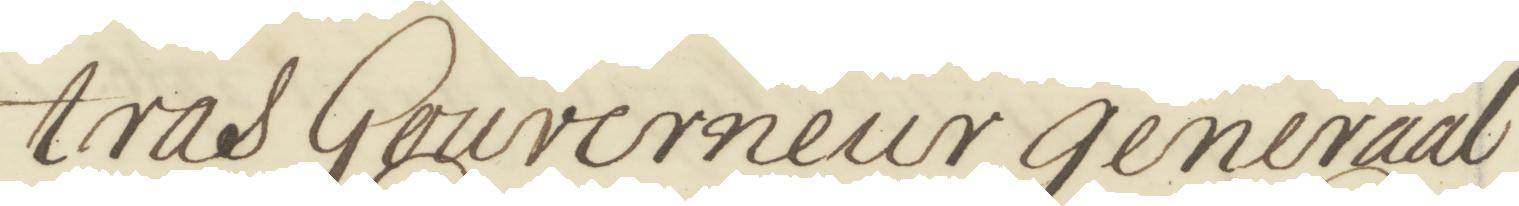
tras Gouverneur generaal
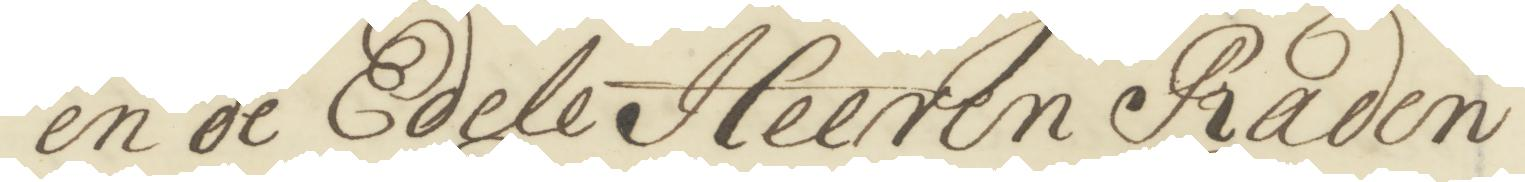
en de Edele Heeren Raden
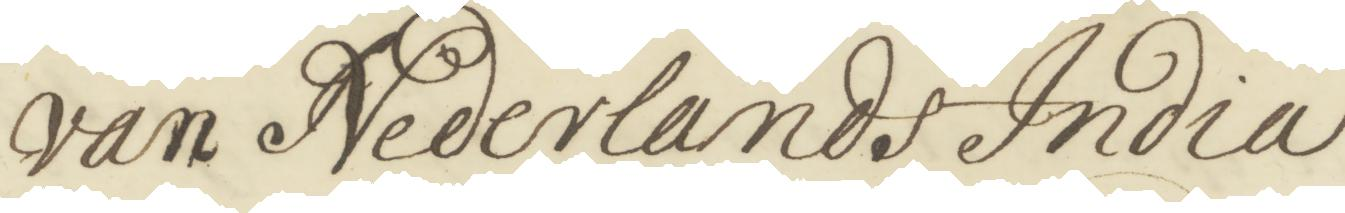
van Nederlands India
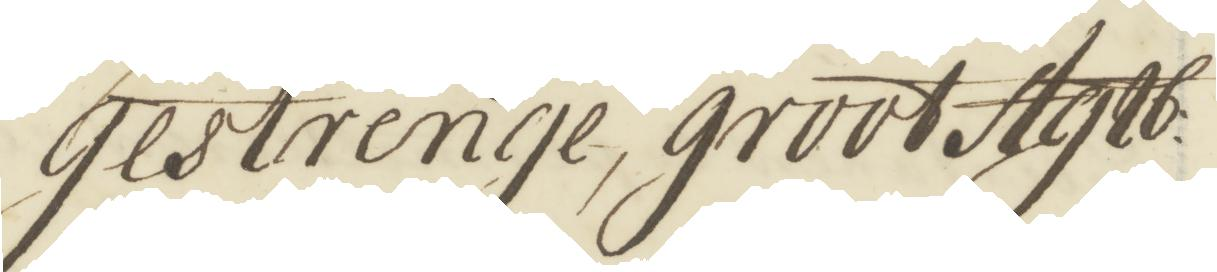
gestrenge, groot Agtb:
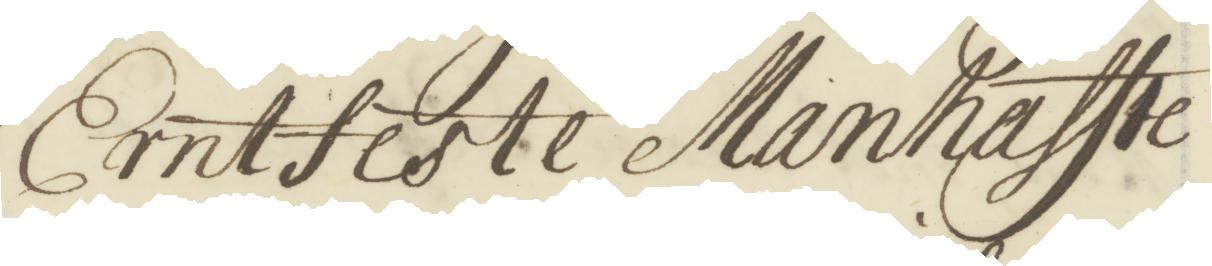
Erntfeste Manhaffte
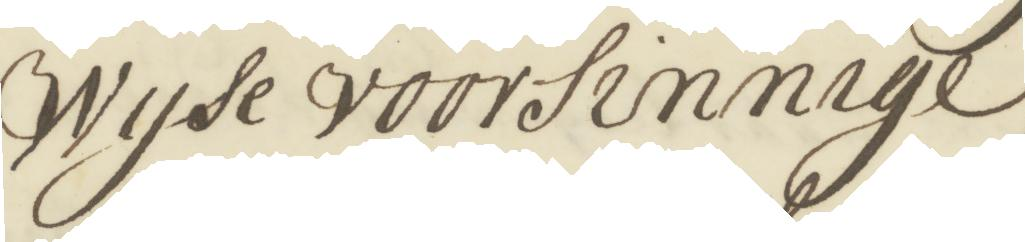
Wyse voorsinnige
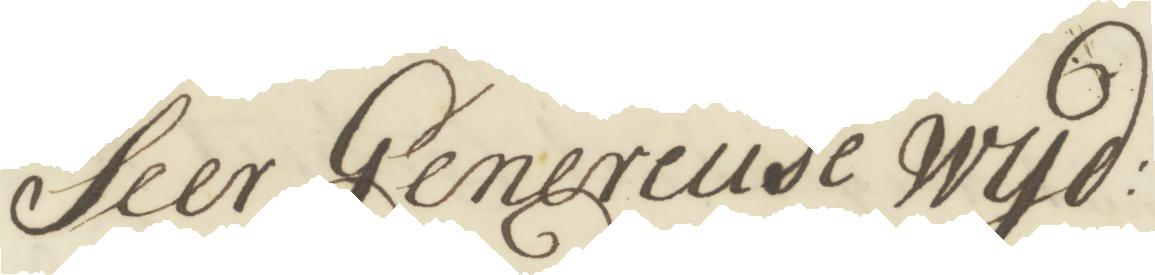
seer Genereuse wijd:
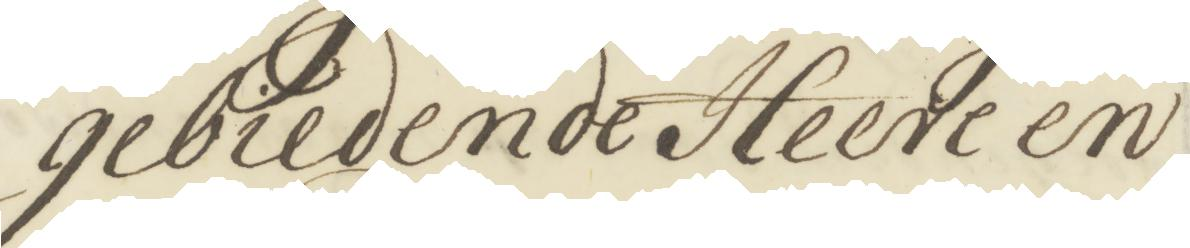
gebiedende Heere en
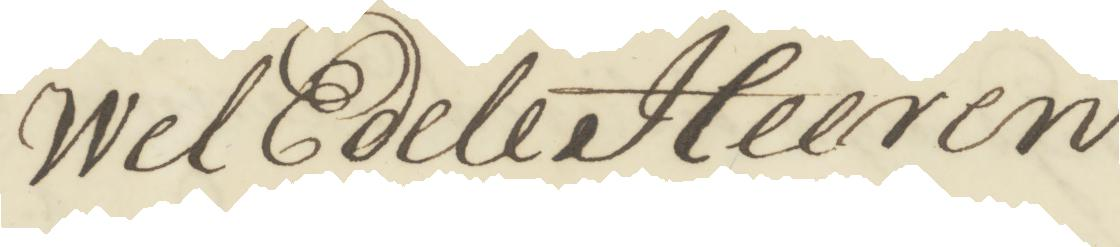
wel Edele Heeren
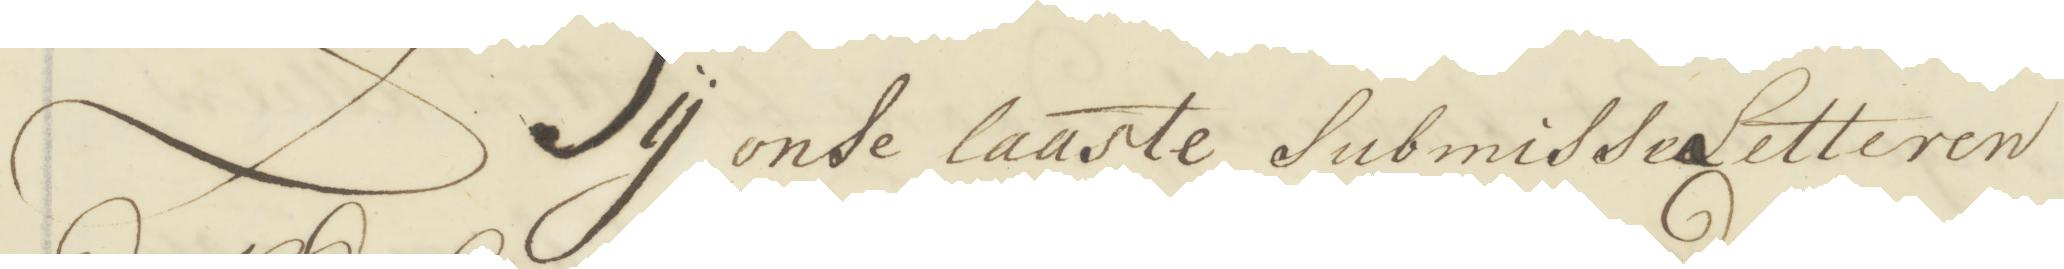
Bij onse laaste submisse Letteren
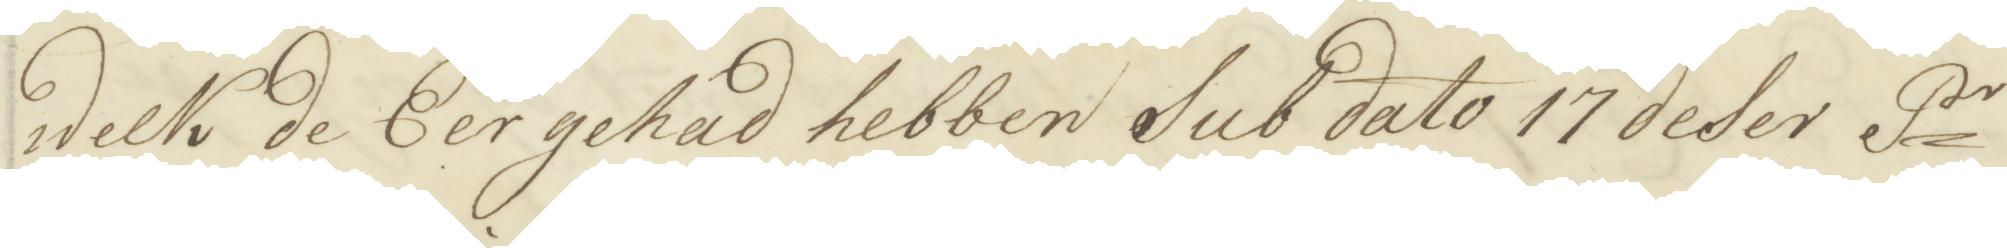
welk de Eer gehad hebben sub dato 17 deser P=r
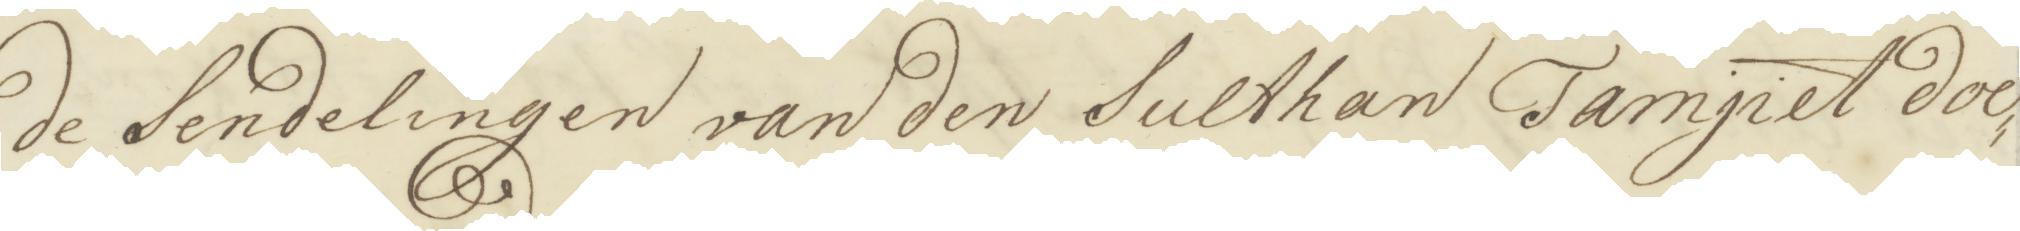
de sendelingen van den sulthan Tamjiet doe„
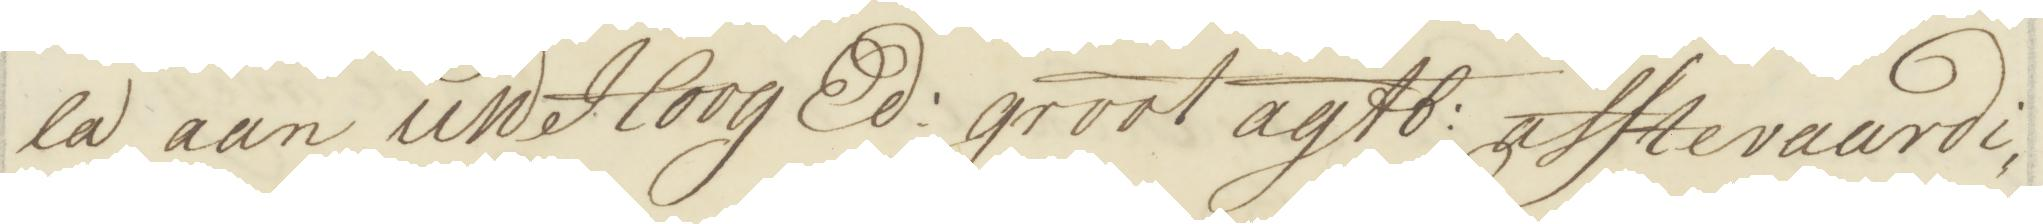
la aan uw Hoog Ed: groot agtb: aff tevaardi„
